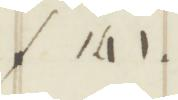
ƒ 141.
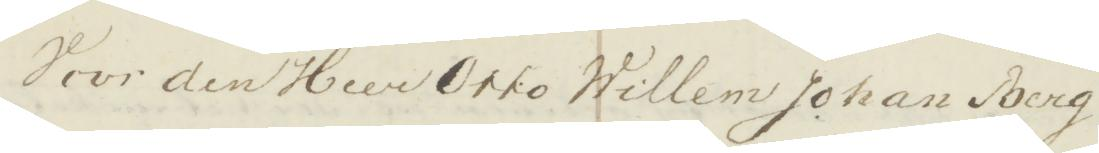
Voor den Heer Otto Willem Johan Berg
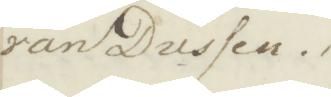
van Dussen.
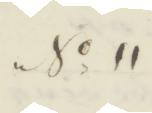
N=o 11
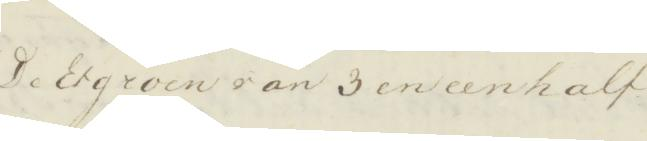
De Etgroen van 3 en een half
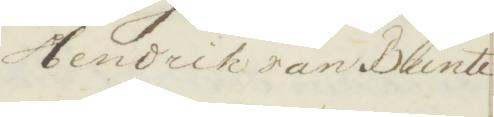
Hendrik van Bunte
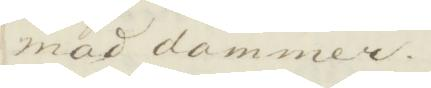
mad dammer.
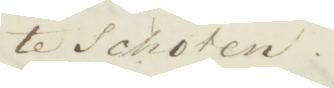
te schoten.
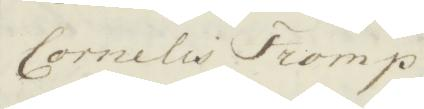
Cornelis Tromp
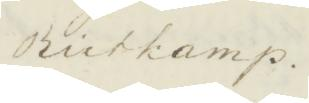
Rietkamp.
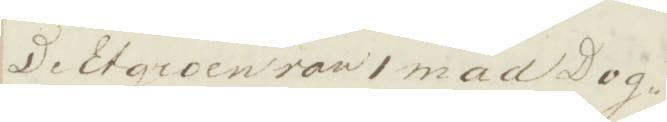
De Etgroen van 1 mad Dog„
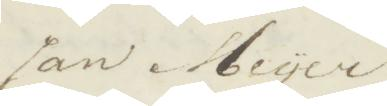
Jan Meijer
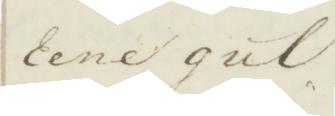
Eene gul„
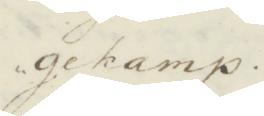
„gekamp.
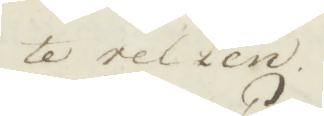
te velren.
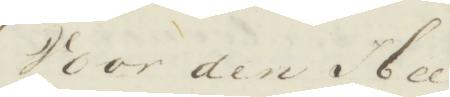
Voor den Heere
